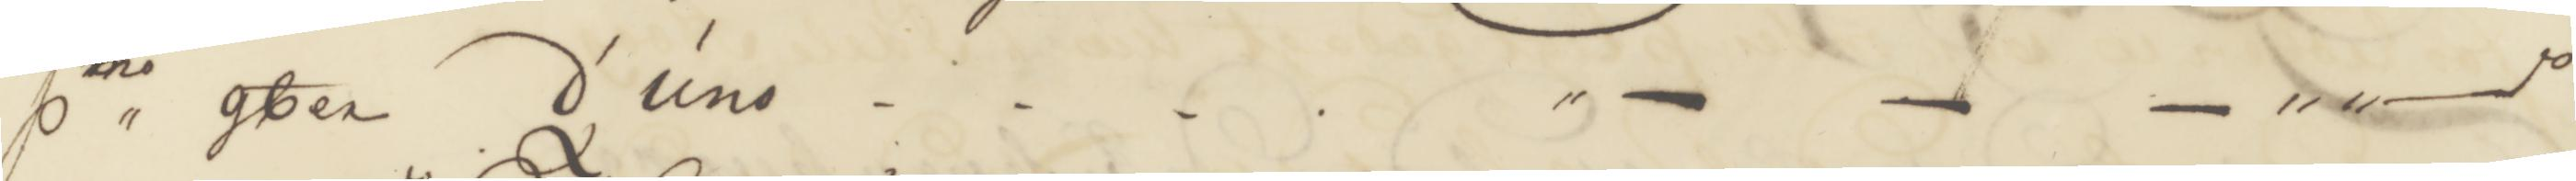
p„mo 9ber d’uno - - - . „ — — — „ „ _o
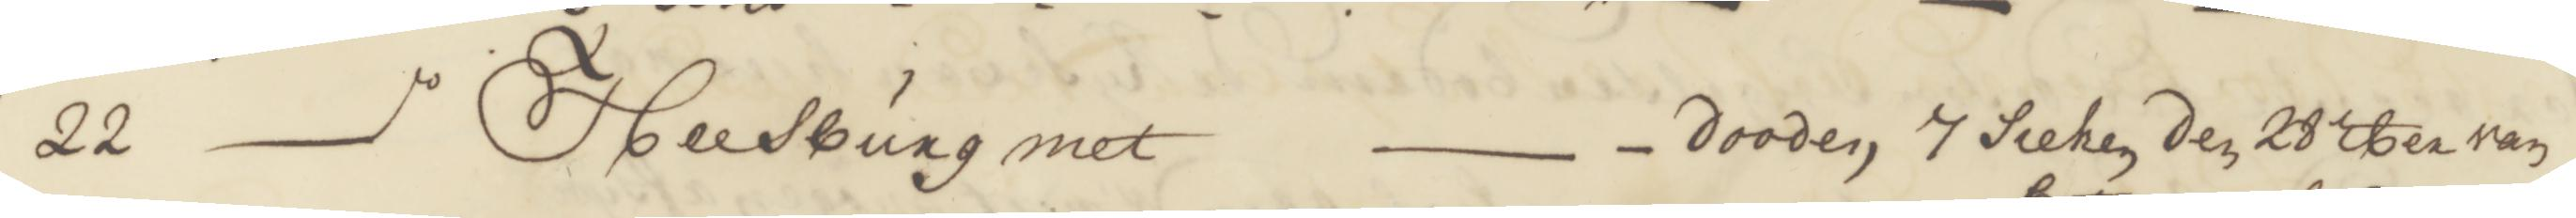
22 _o Heesburg met — – dooden 7 sieken den 28 7ber van
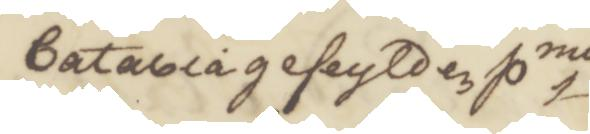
batavia geseyld en p„mo
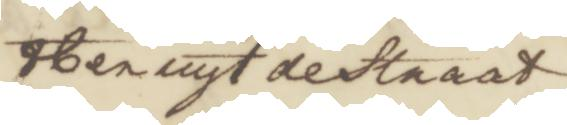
9ber uyt de straat
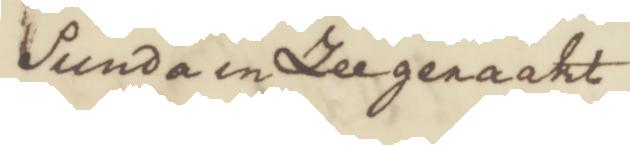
sunda in zee geraakt
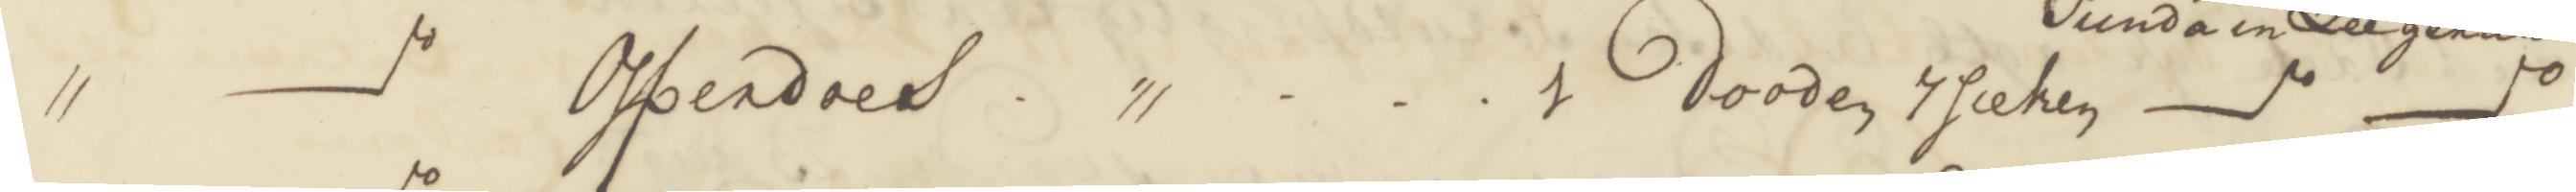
„ _o opperdoes - ,„ - - . 1 dooden 7 sieken _o _o
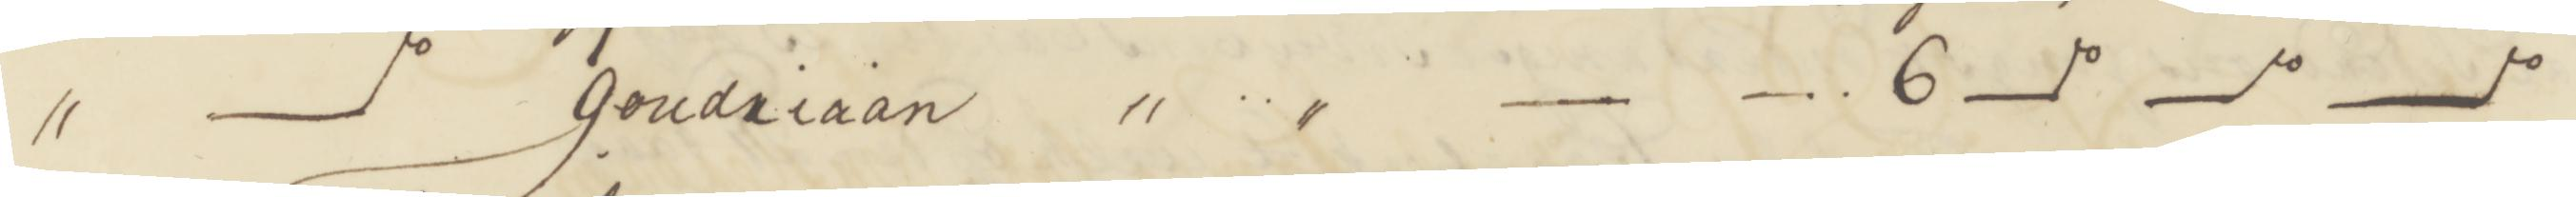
„ _o goudriaan „ . . „ — —. . 6 _o _o _o
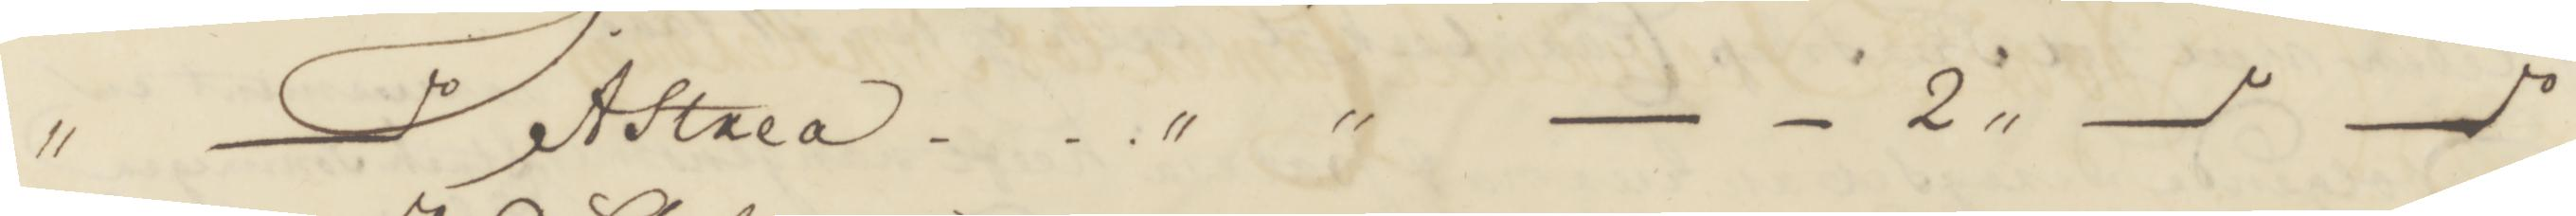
„ _o Astrea - - . „ „ — – 2 „ _o _o
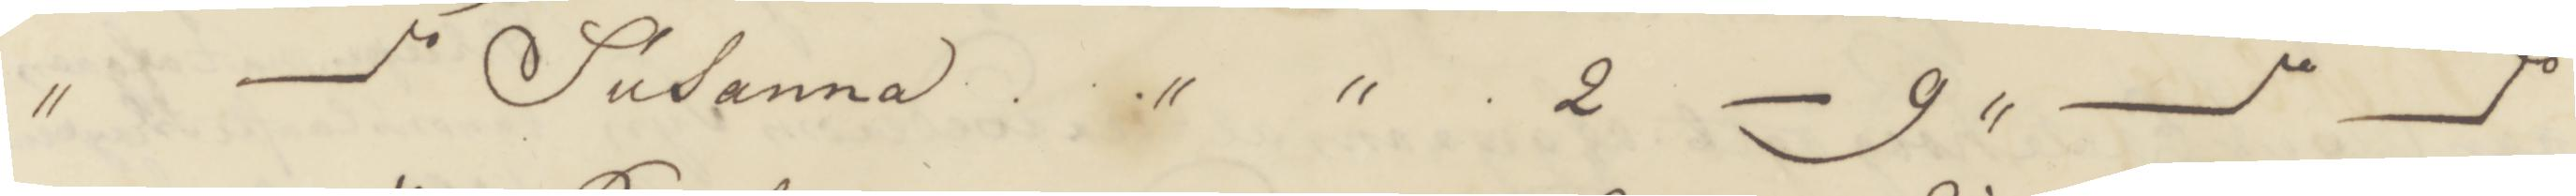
„ _o Susanna . . „ „ . 2 — 9 „ _o _o
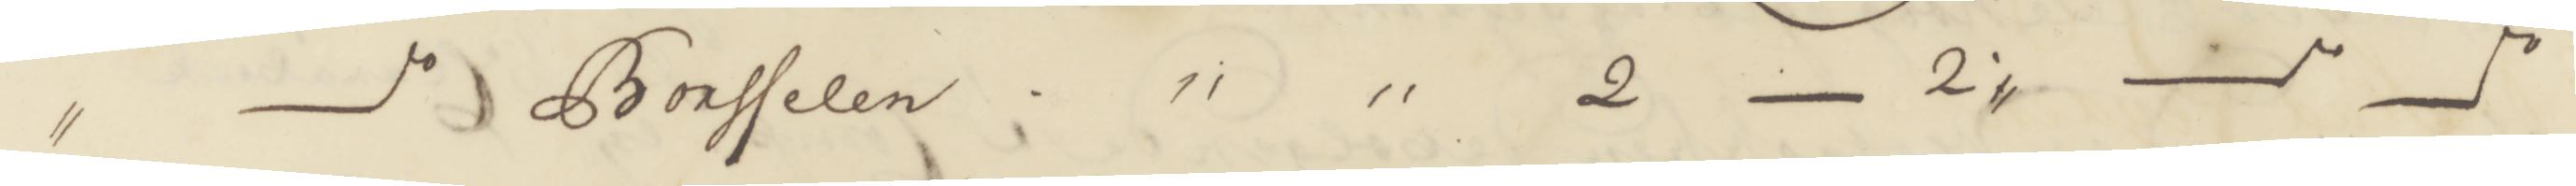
„ _o Borsselen - „ „ 2 — 2 „ _o _o
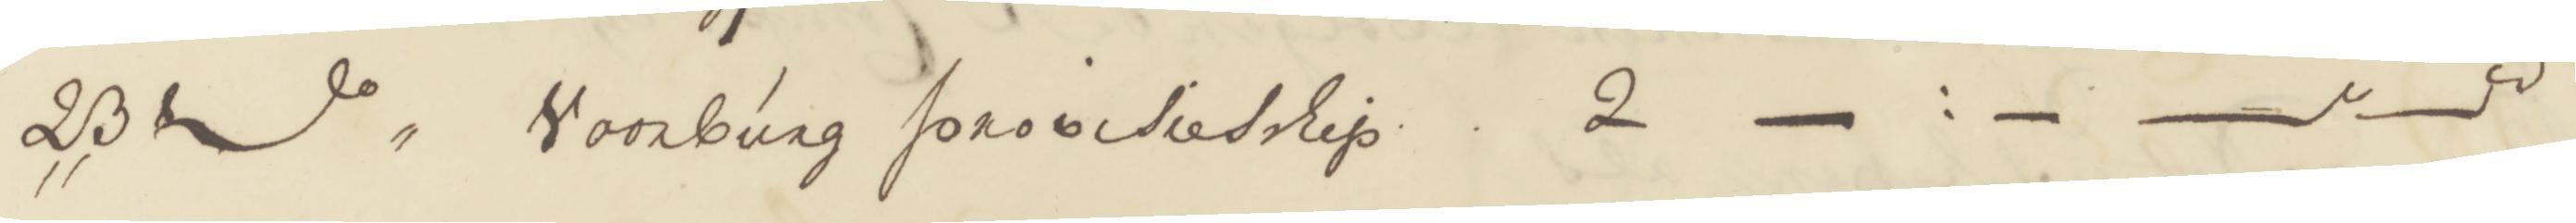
23 _„o voorburg provisieschip. . 2 — : — _o _o
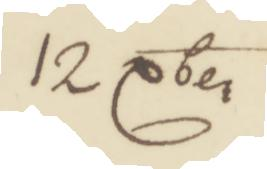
12 xber
